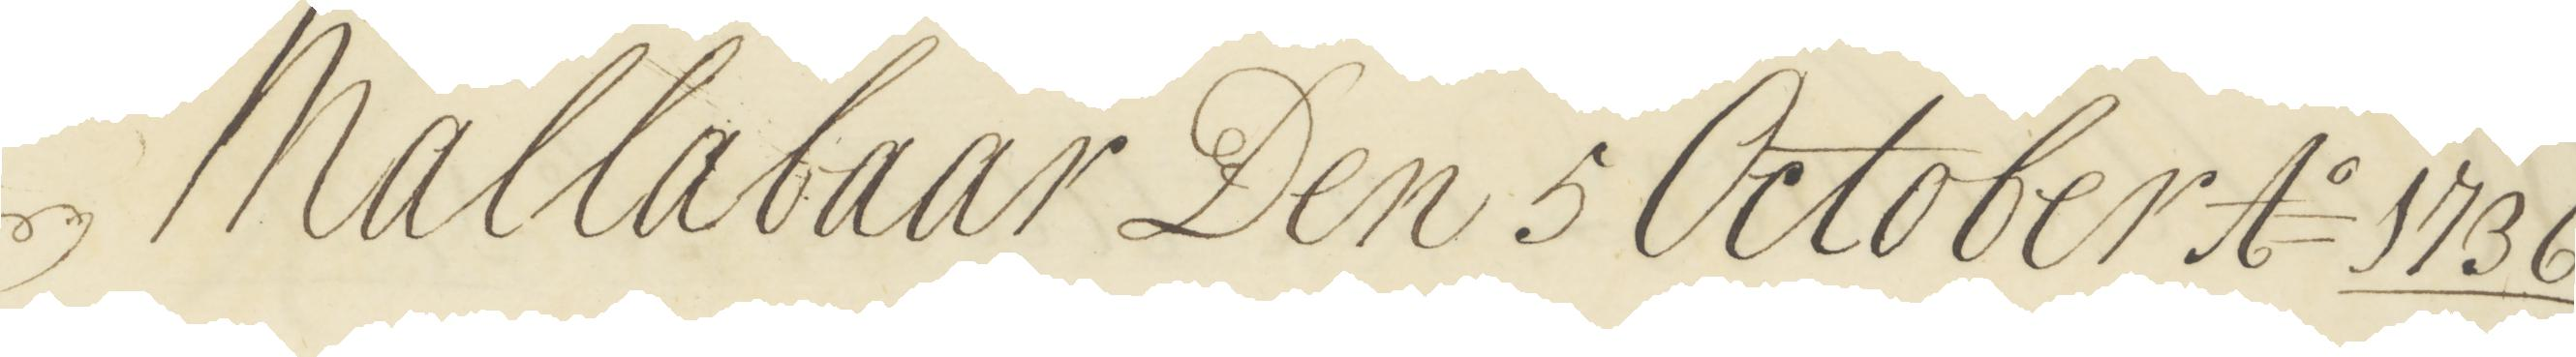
Mallabaar Den 5 October A=o 1736
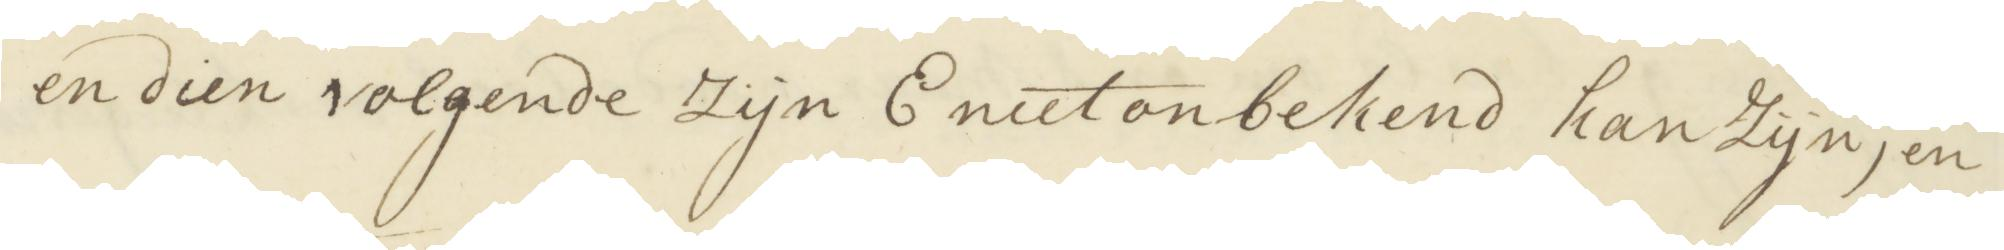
en dien volgende zijn E niet onbekend kan Zijn, en
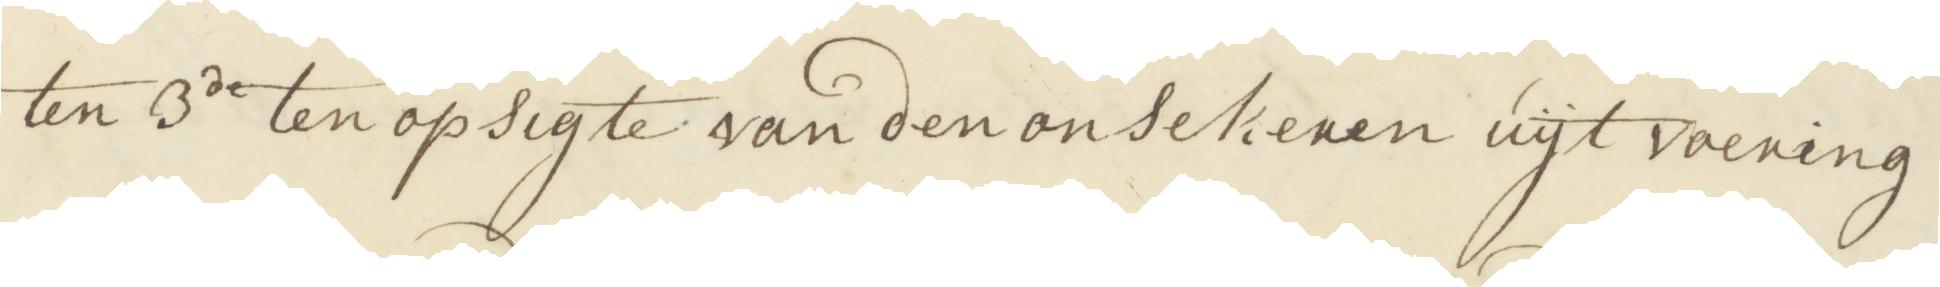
ten 3:de ten opsigte van den onsekeren uijtvoering
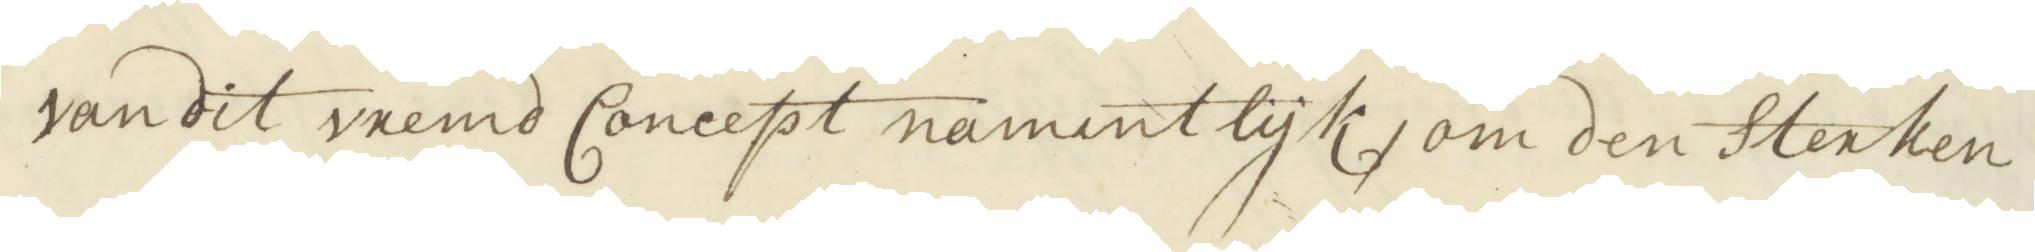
van dit vremd Concept namentlijk, om den sterken
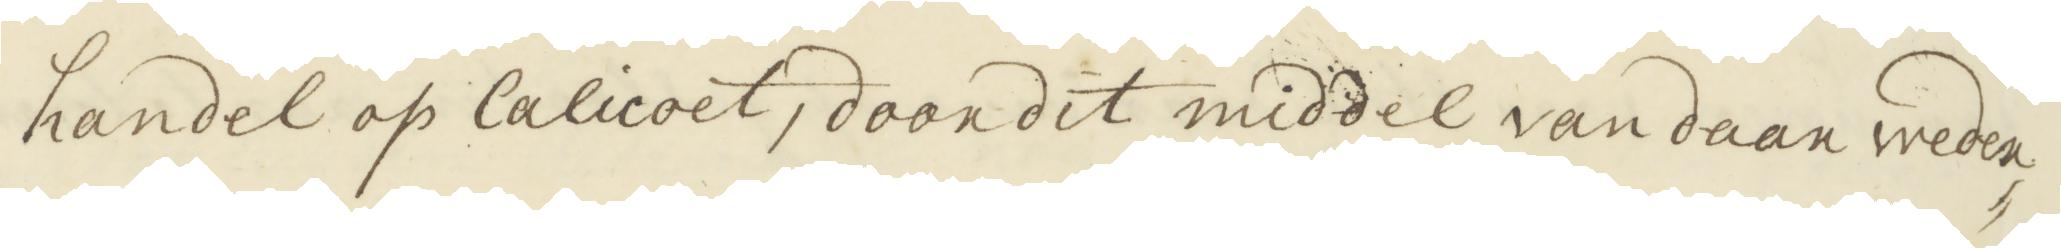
handel op Calicoet, door dit middel van daar weder„
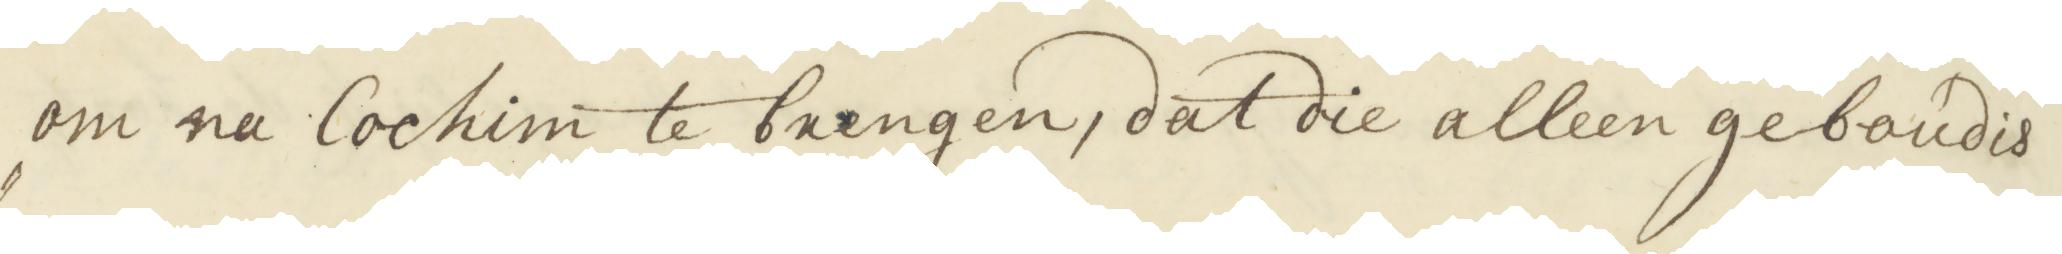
„om na Cochim te brengen, dat die alleen geboud is
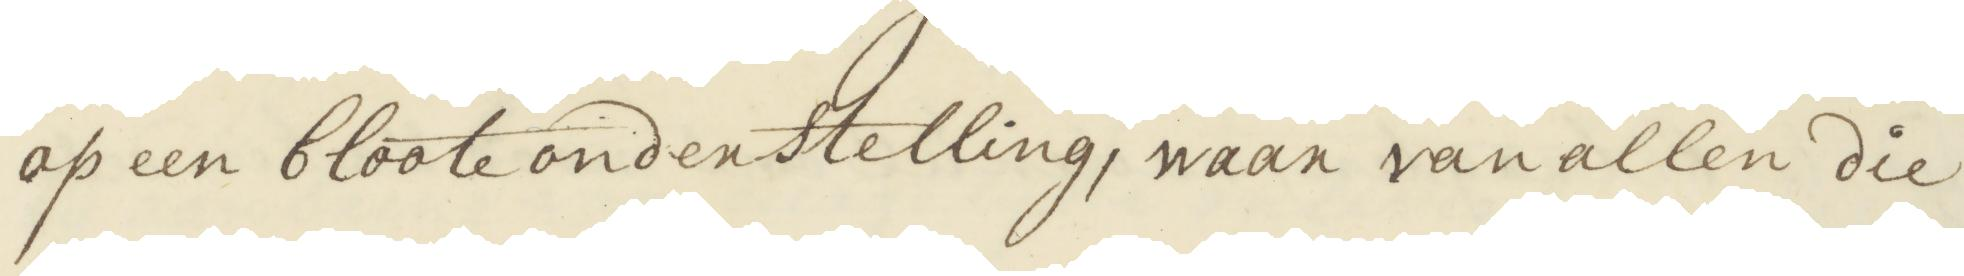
op een bloote onderstelling, waar van allen die
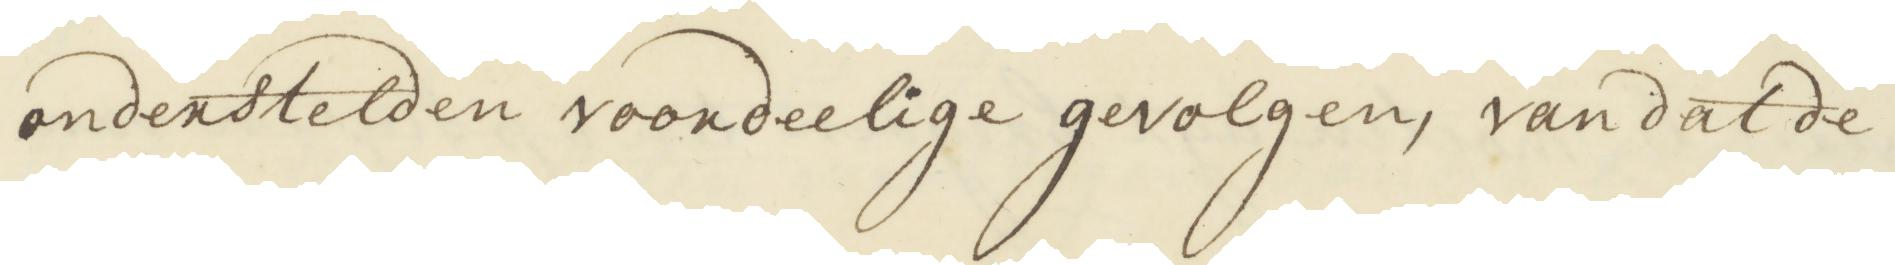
onderstelden voordeelige gevolgen, van dat de
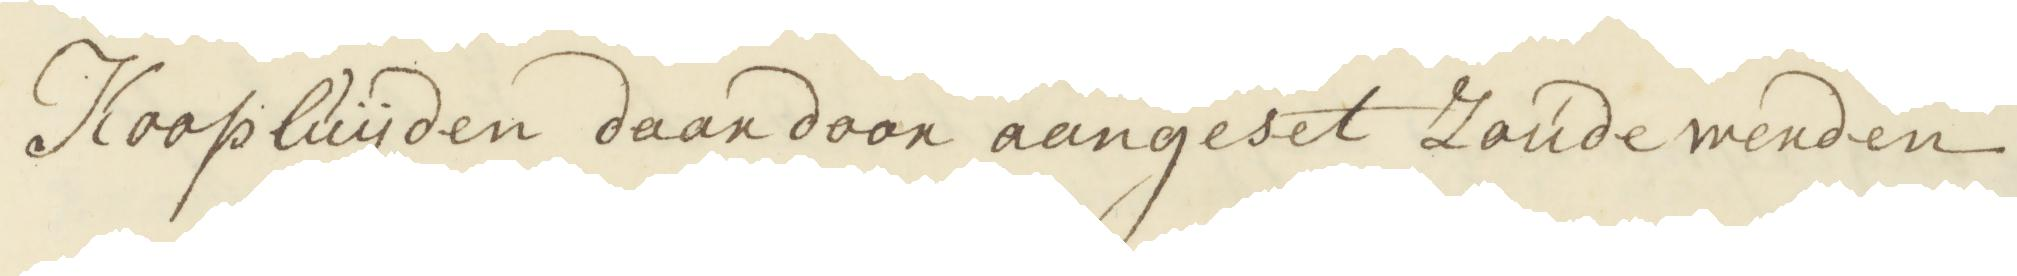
Koopluijden daar door aangeset Zoude werden
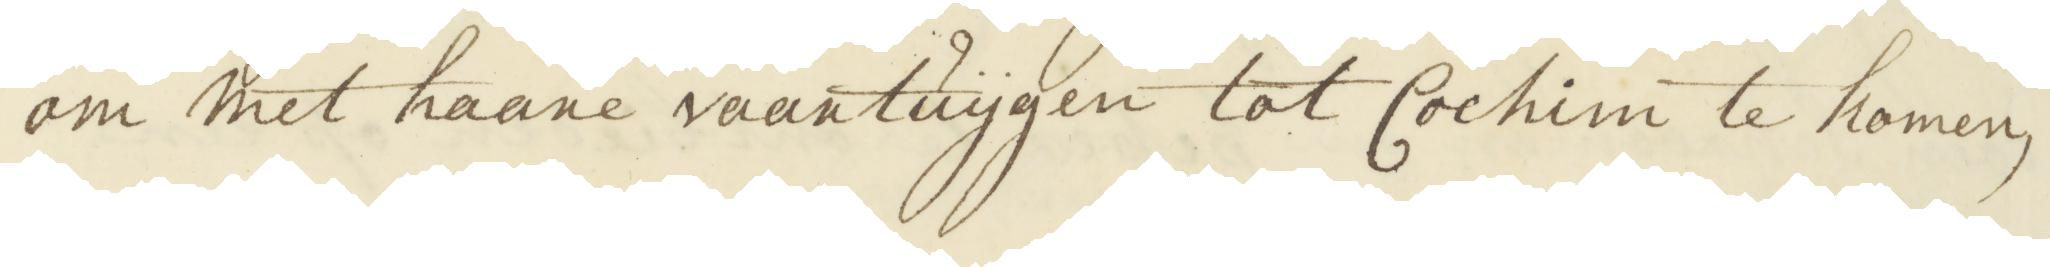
om met haare vaartuijgen tot Cochim te komen,
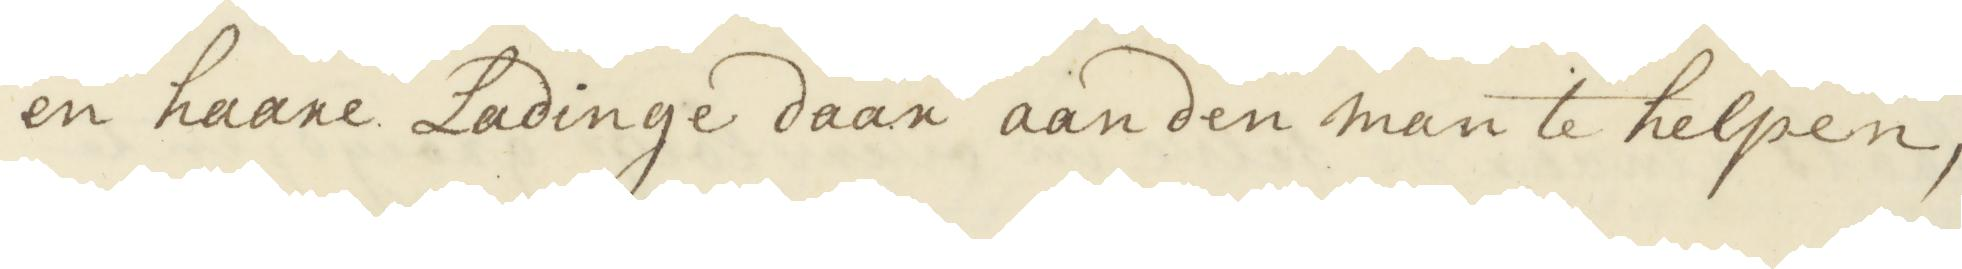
en haare Ladinge daar aan den man te helpen,
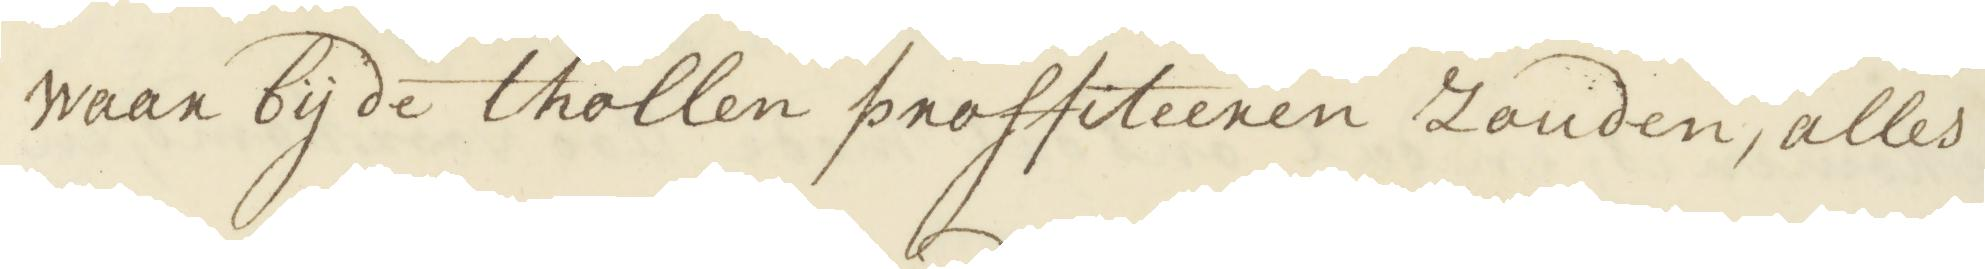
waar bij de thollen proffiteeren zouden, alles
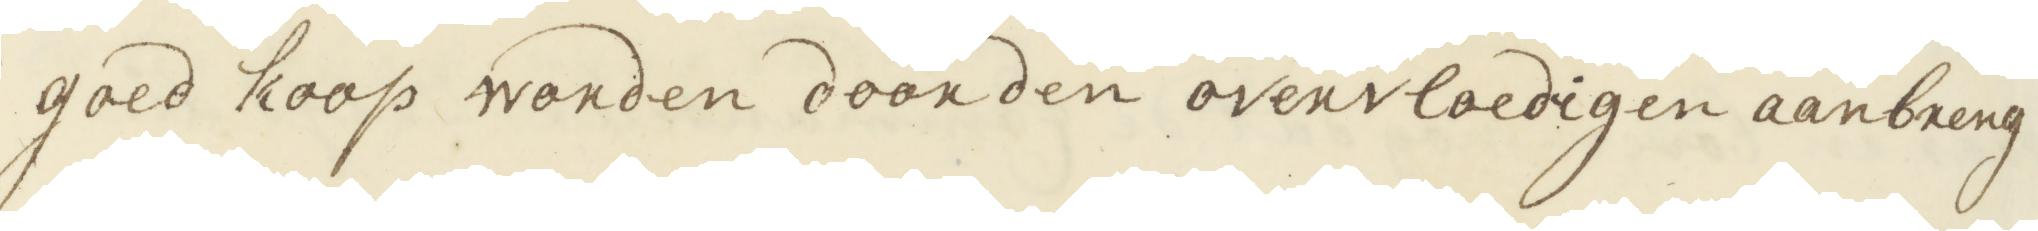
goed koop worden door den overvloedigen aanbreng
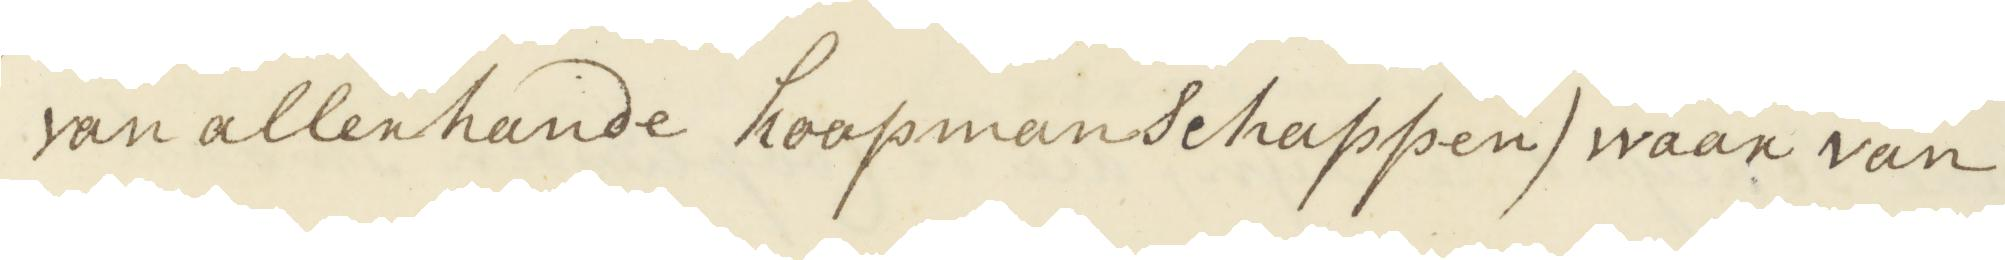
van allerhande koopmanschappen ) waar van
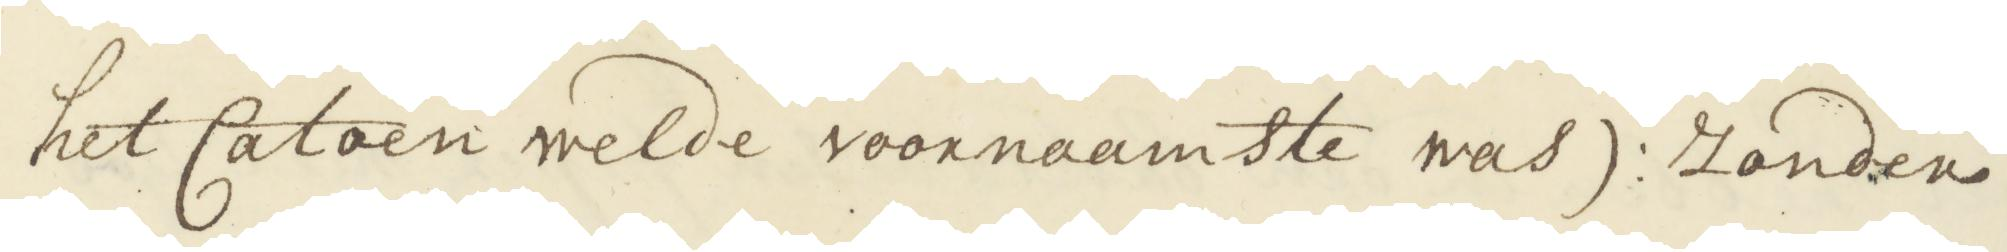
het Catoen wel de voornaamste was ) : Zonder
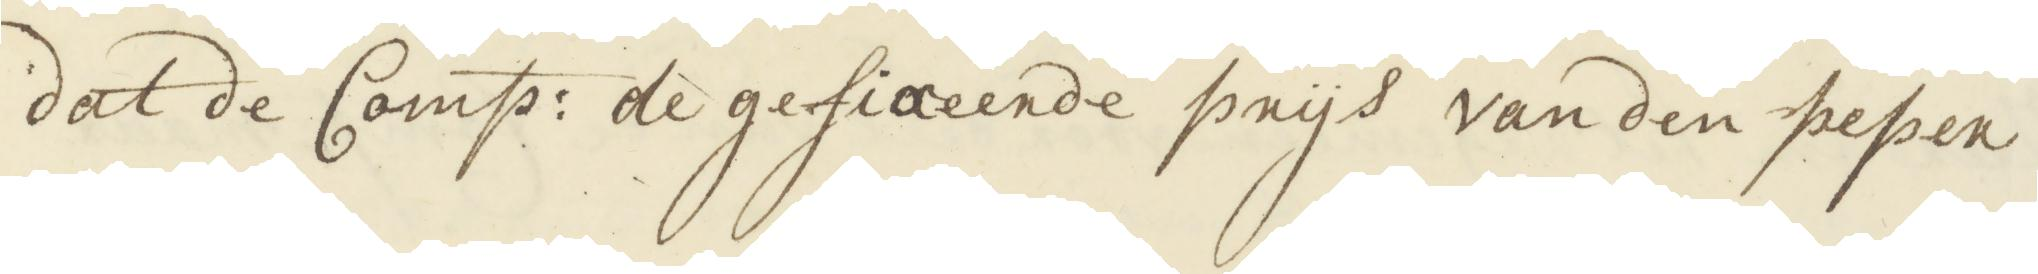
dat de Comp: de gefixeerde prijs van den peper
